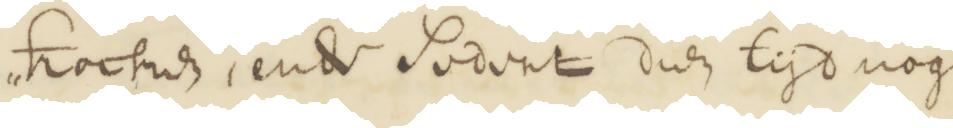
„trocken, ende sedert dien tijd nog
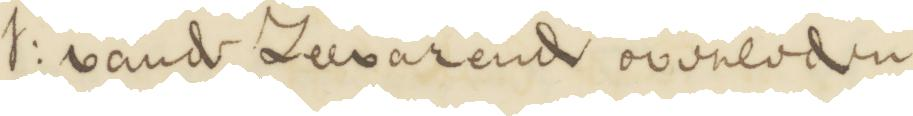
1: vande zeevarende overleden
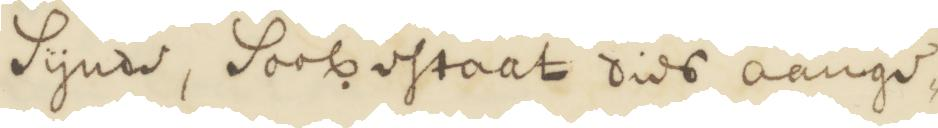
sijnde, soobestaat dies aange„
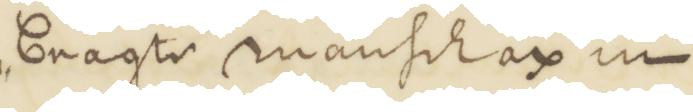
„bragte manschap in
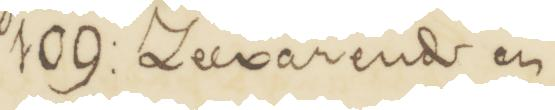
109: zeevarende en
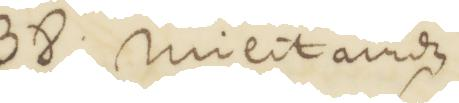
38: militairen
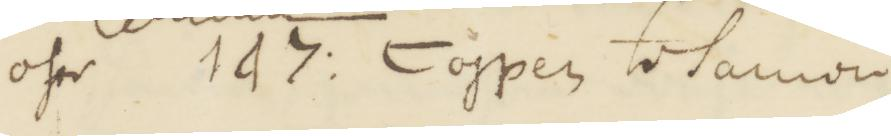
ofte 147: Coppen tesamen
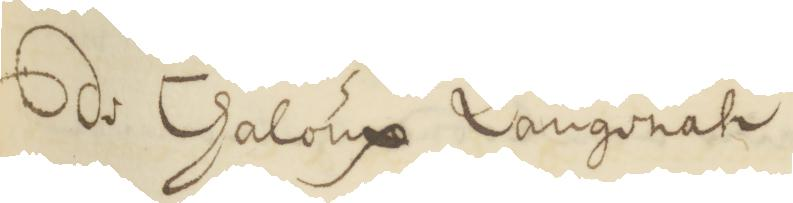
de Chaloup Langerak
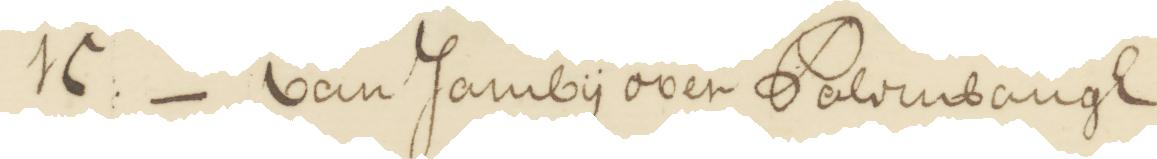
15: - van Jambij over Palembangh
